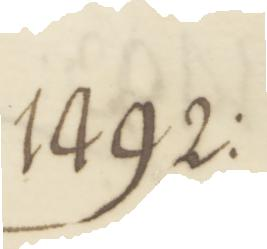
1492:
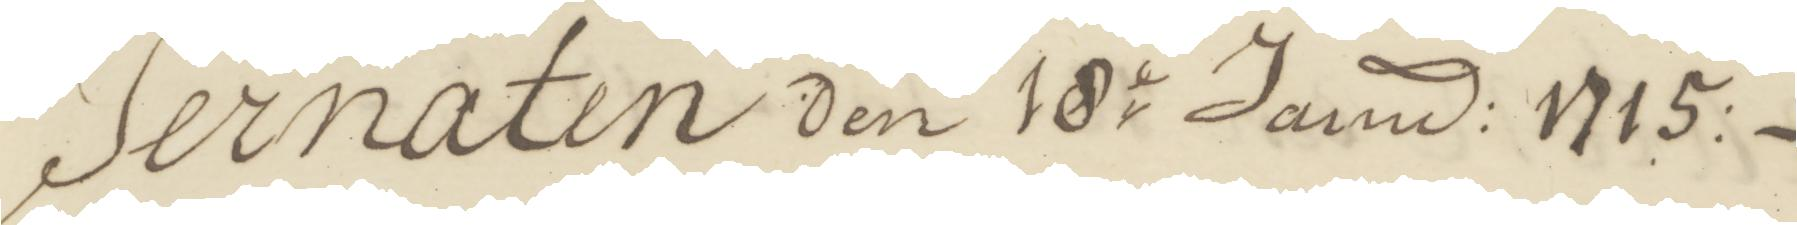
Ternaten den 18„e Janu: 1715: -
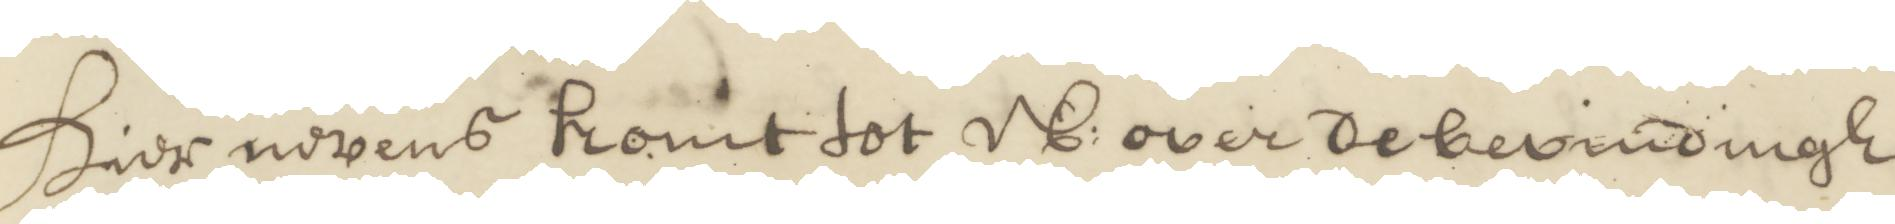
Hier nevens komt tot UE: over de bevindingh
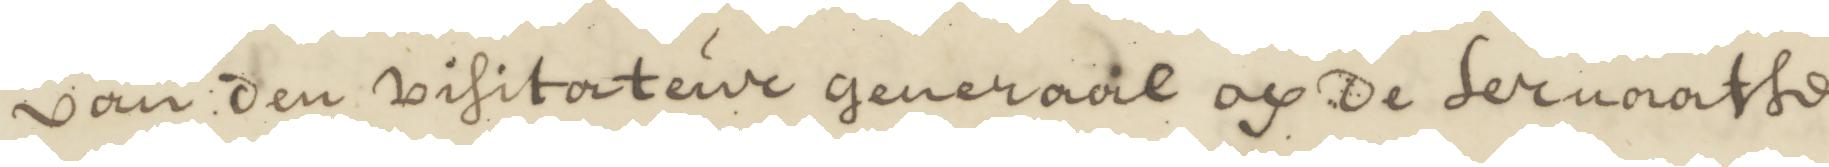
van den visitateur generaal op de ternaatse
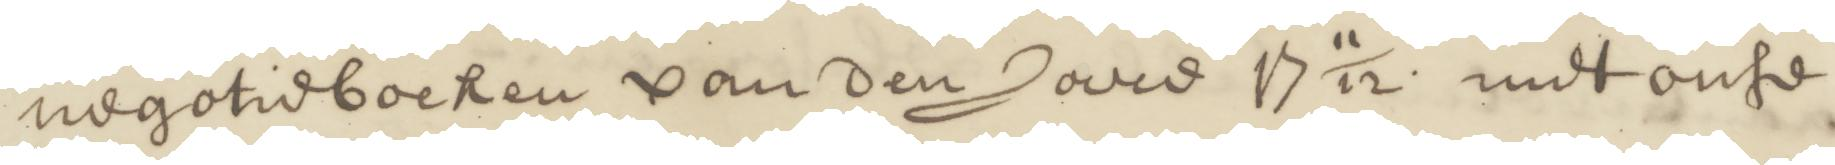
negotieboeken van den Jare 1711/12 met onse
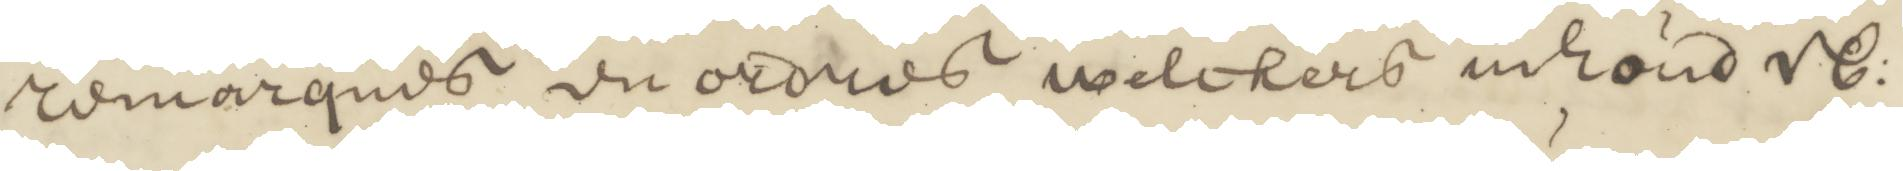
remarques en ordres welckers inhoud UE:
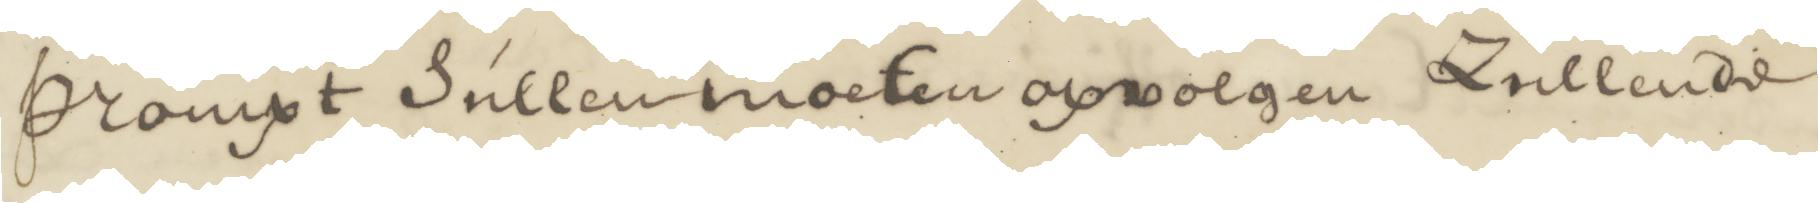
promp. sullen moeten opvolgen Zullende
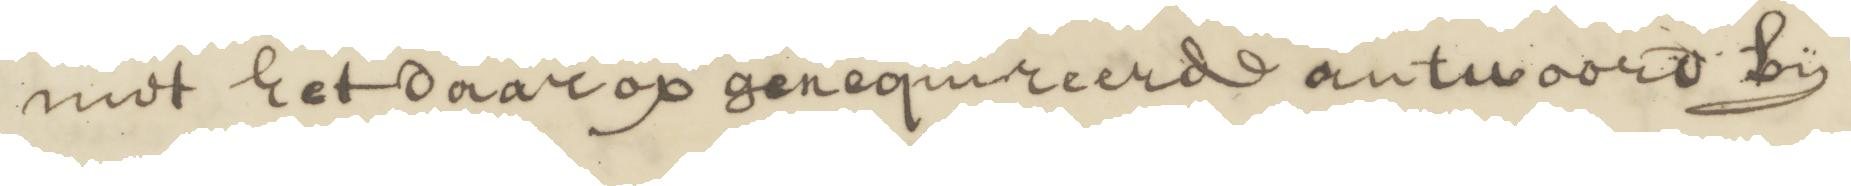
met het daarop gerequireerde antwoord bij
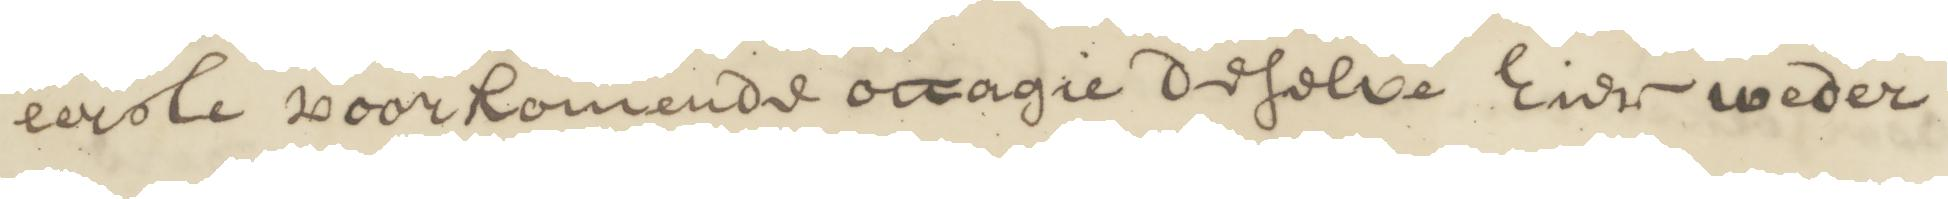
eerste voorkomende occagie deselve hier weder
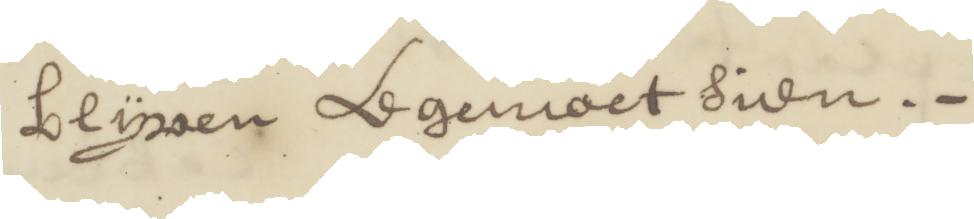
blijven te gemoet sien.-
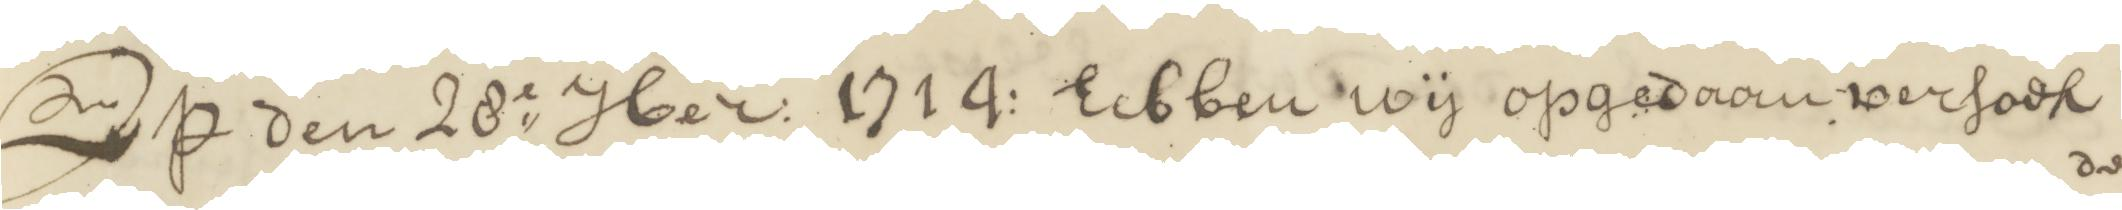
Op den 28„e Jber: 1714: hebben wij opgedaan versoek
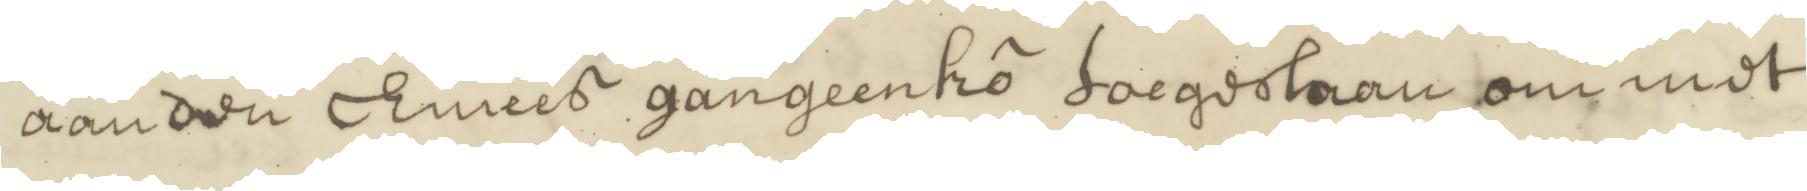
aan den Chinees gangeenkô toegestaan om met
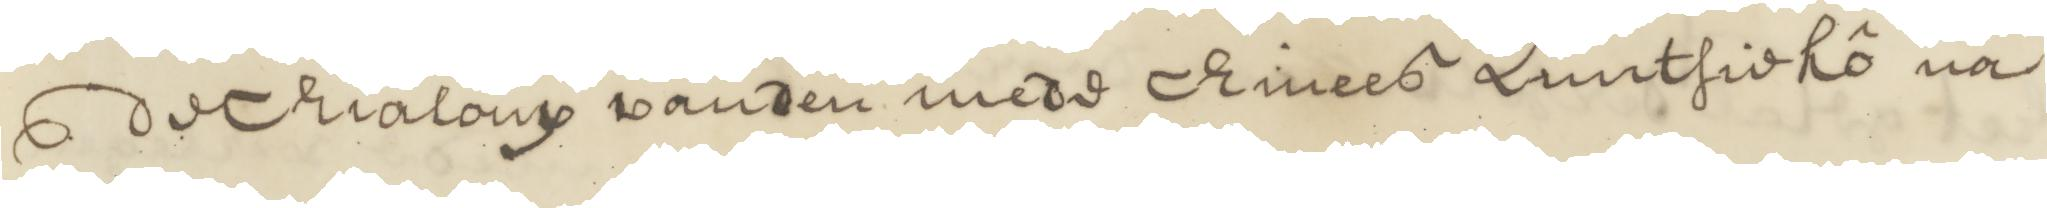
de Chialoup van den mede Chinees Lintsiekô na
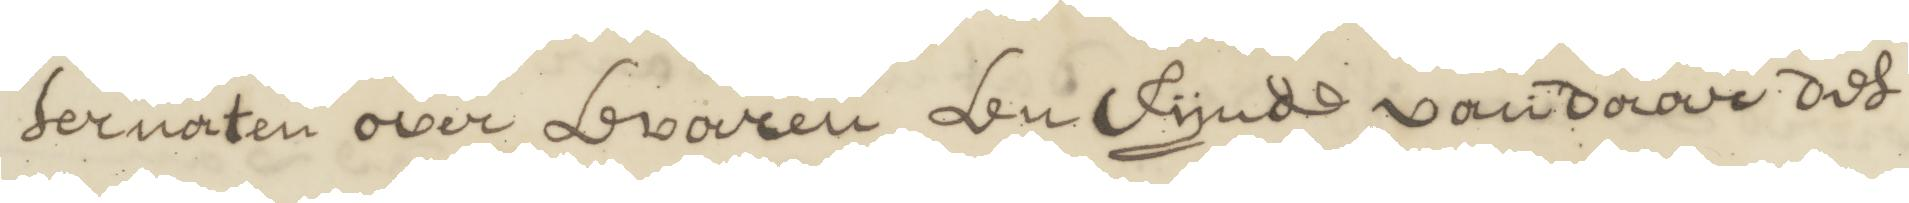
ternaten over tevaren ten eijnde van daar des
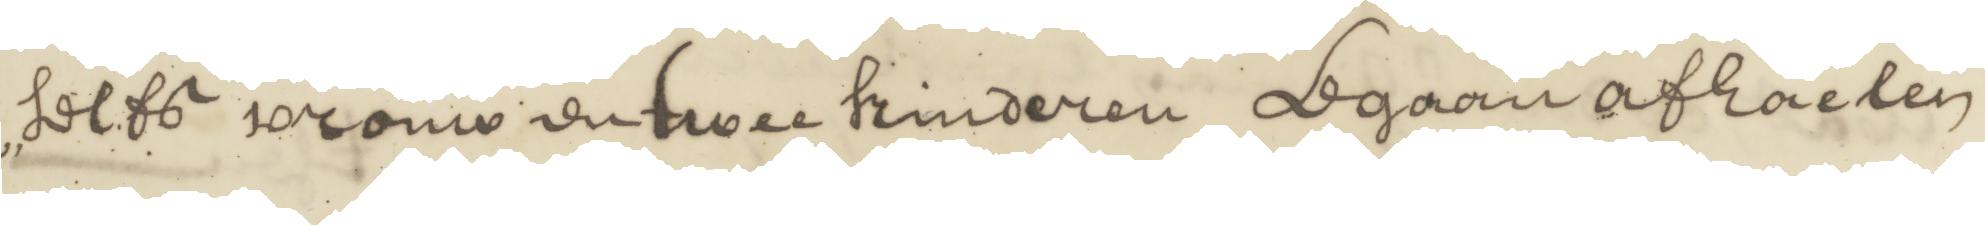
„selfs vrouw en twee kinderen tegaan afhaelen
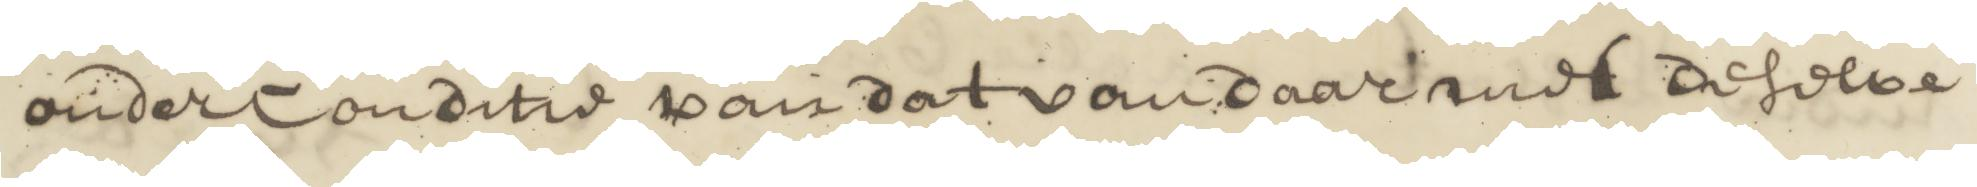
onder conditie van dat van daar met deselve
